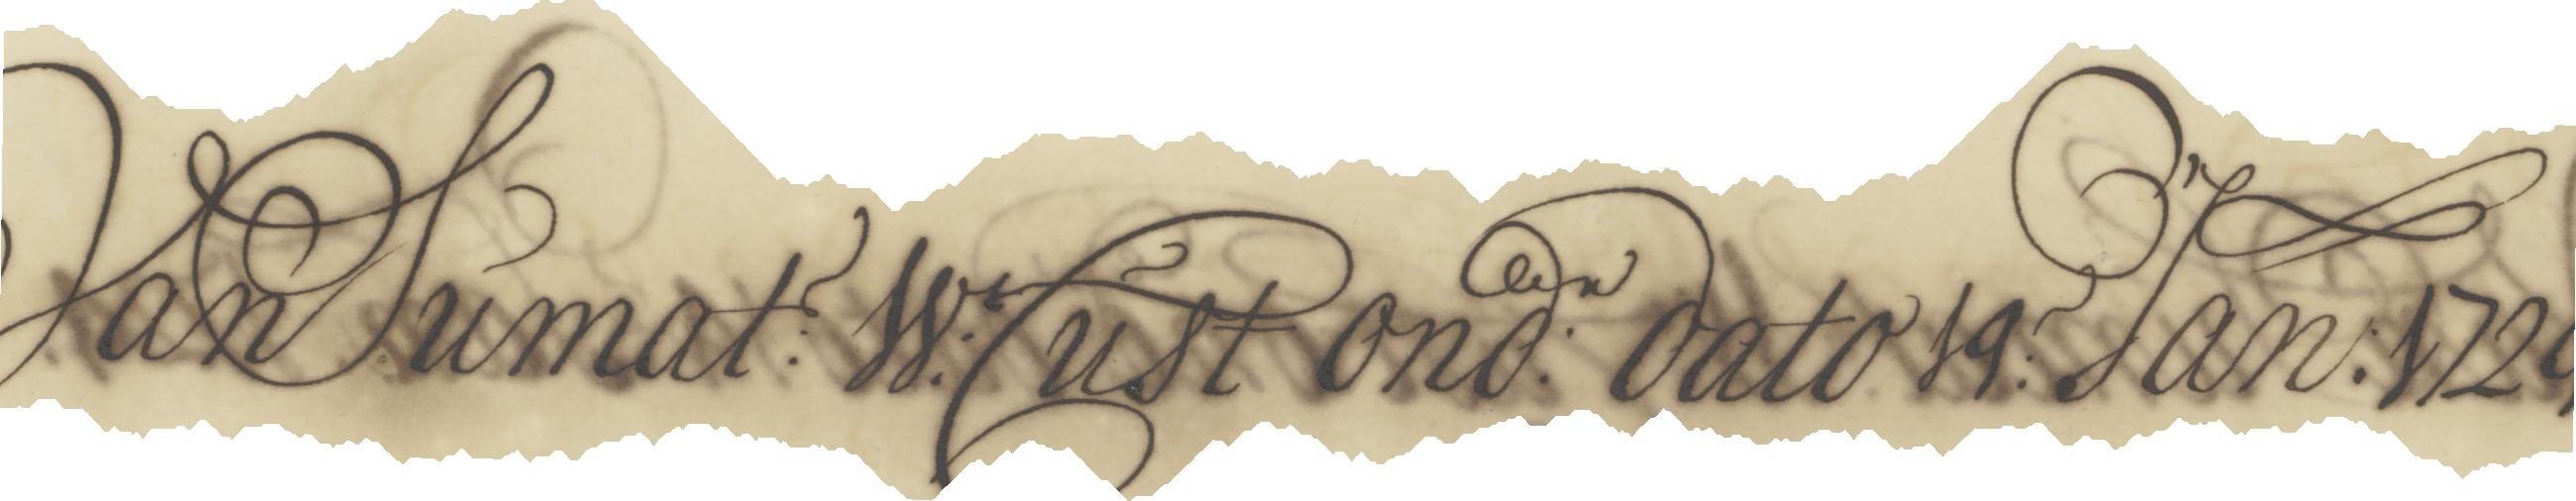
Van Sumat:s W:t Cust ond:r dato 14:' Jan: 1724.
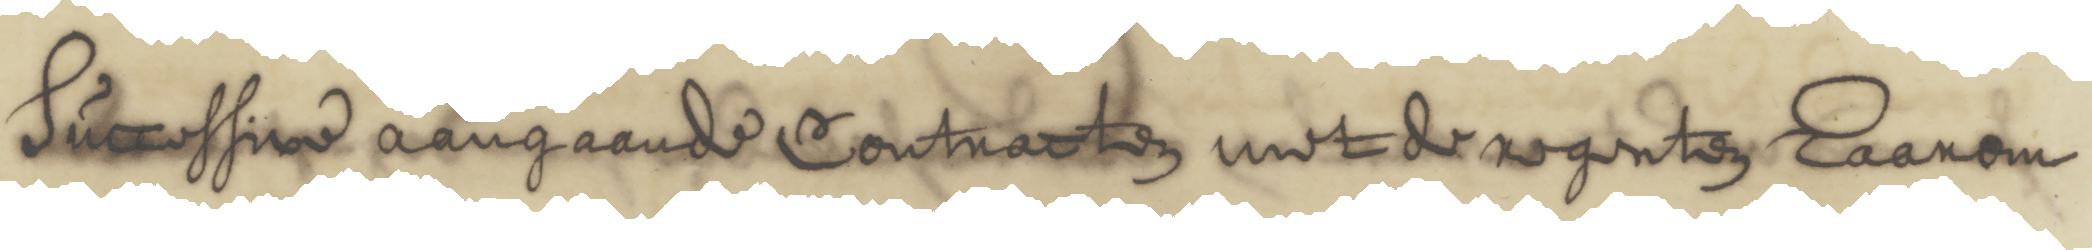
Successive aangaande Contracten met de regenten haarom
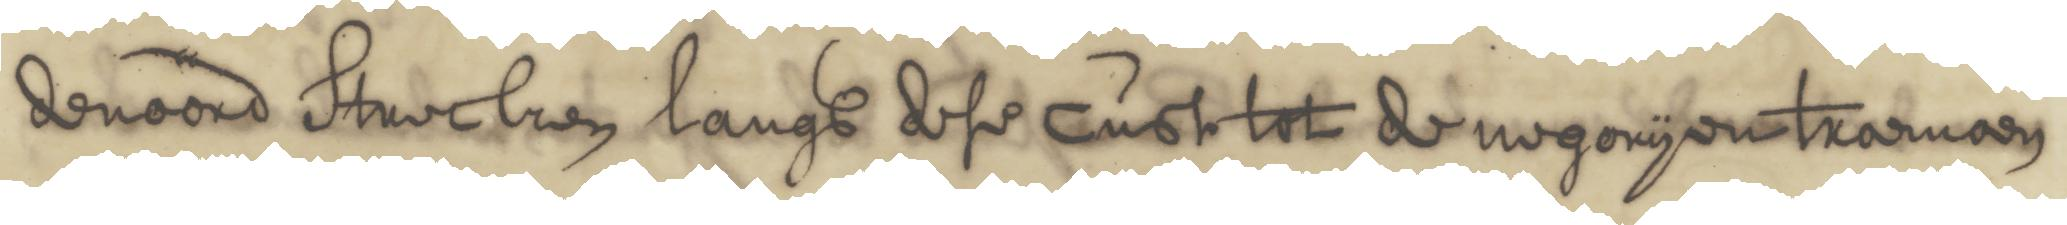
denoord strecken langs dese cust tot de negorijen troemoen
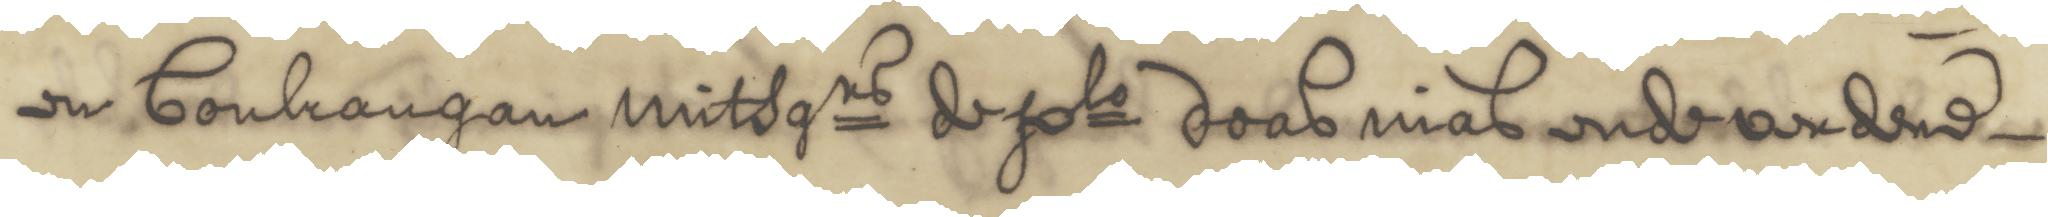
en bonkangan, mitsg=rs de p=lo doas nias ende verdere
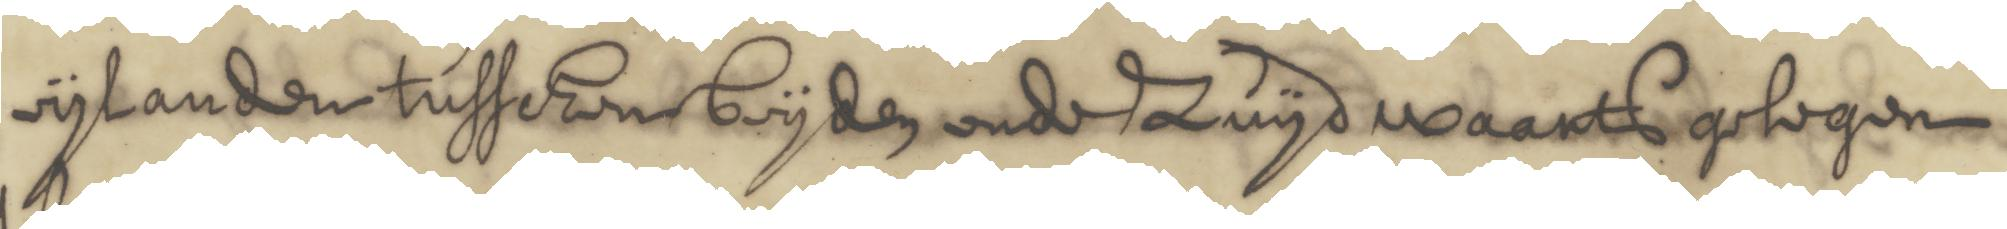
eijlanden tusschenbeijden ende Zuijdwaarts gelegen
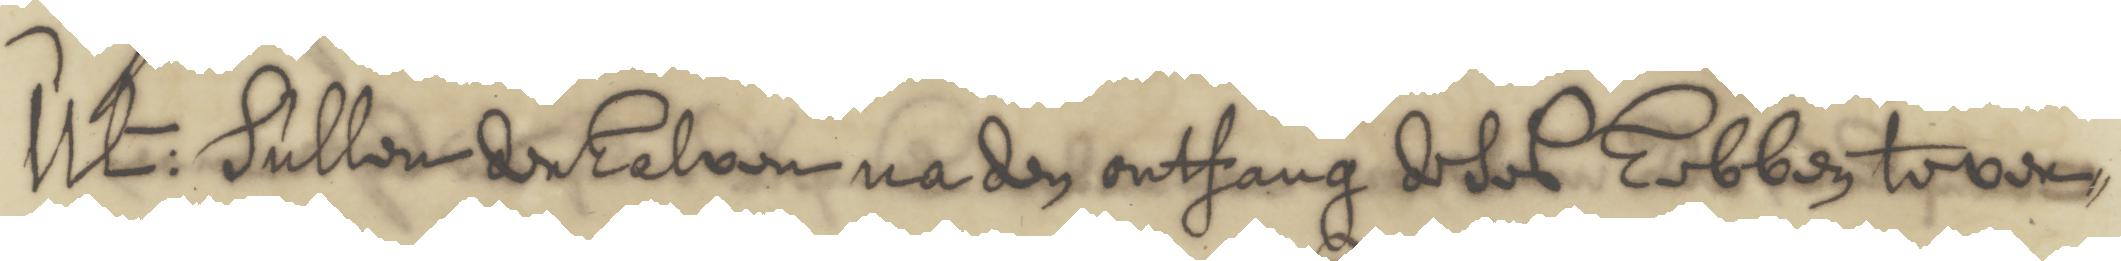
UL: sullen derzelven na den ontfang deses hebben te ver„
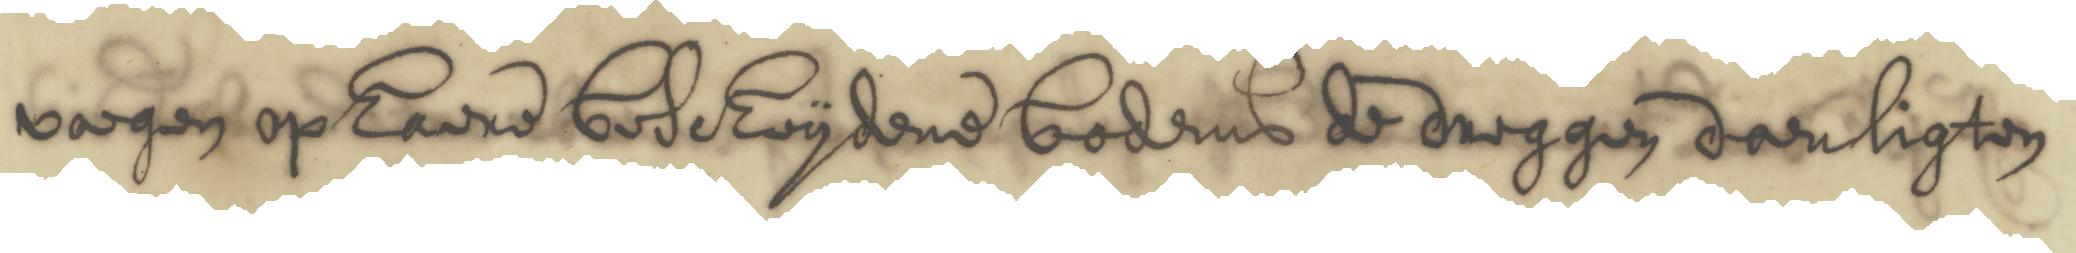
voegen op haere bescheijdene bodems de dreggen doen ligten
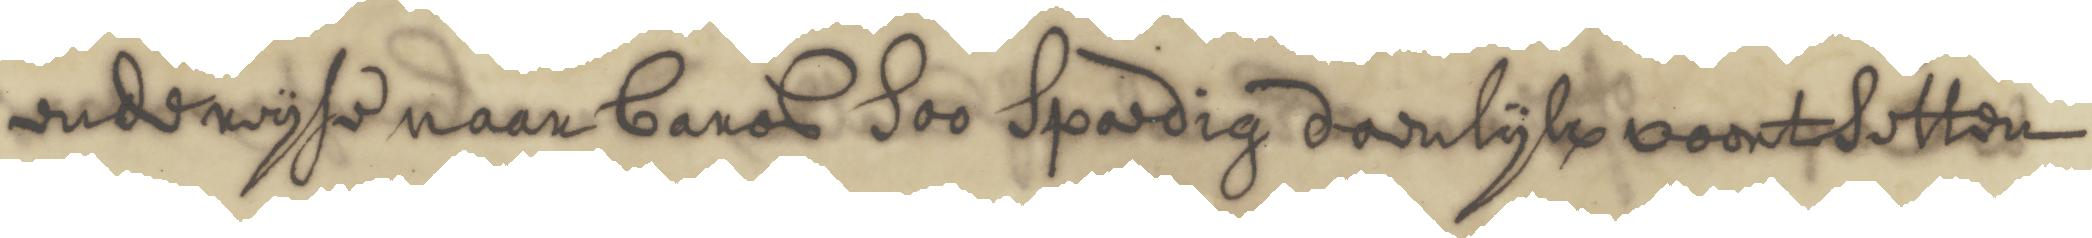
en de reijse naar baros soo spoedig doenlijk voortsetten
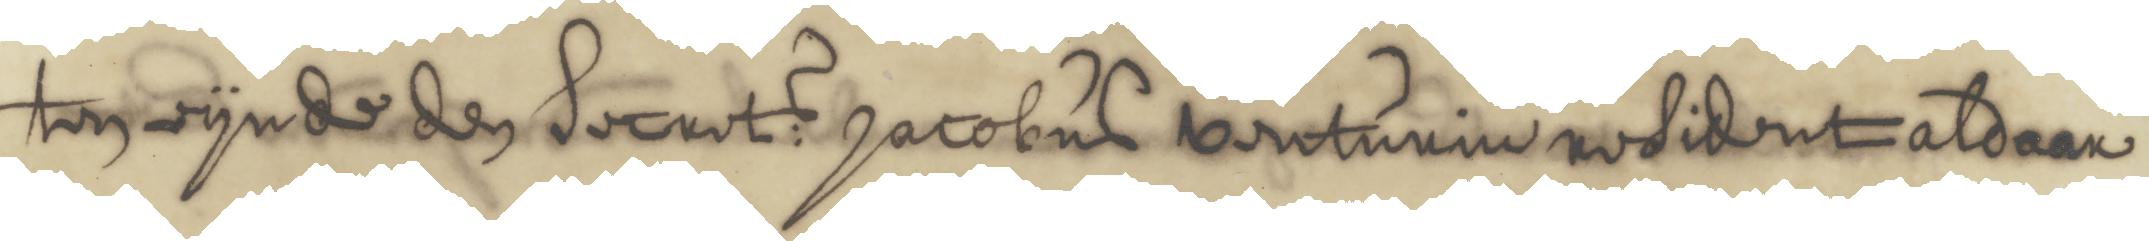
ten eijnde den secret:s jacobus venturin resident aldaar
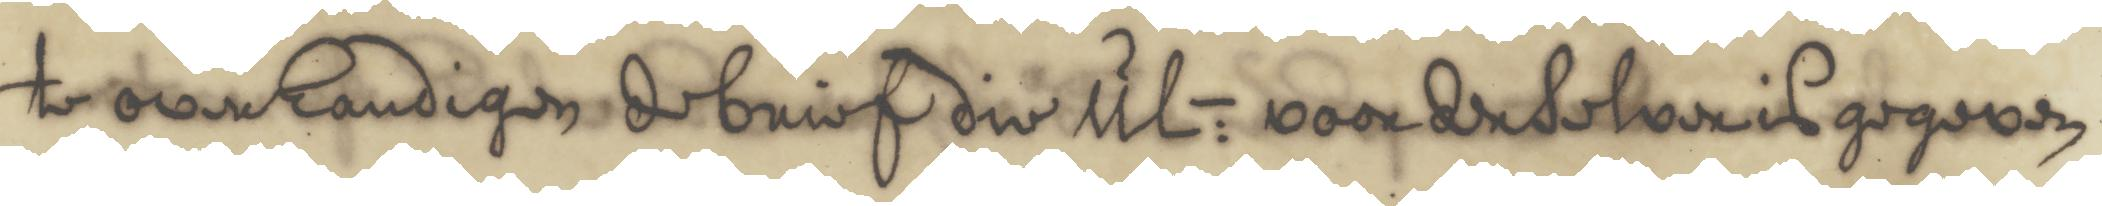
’t overhandigen de brief die UL: voor denselven is gegeven
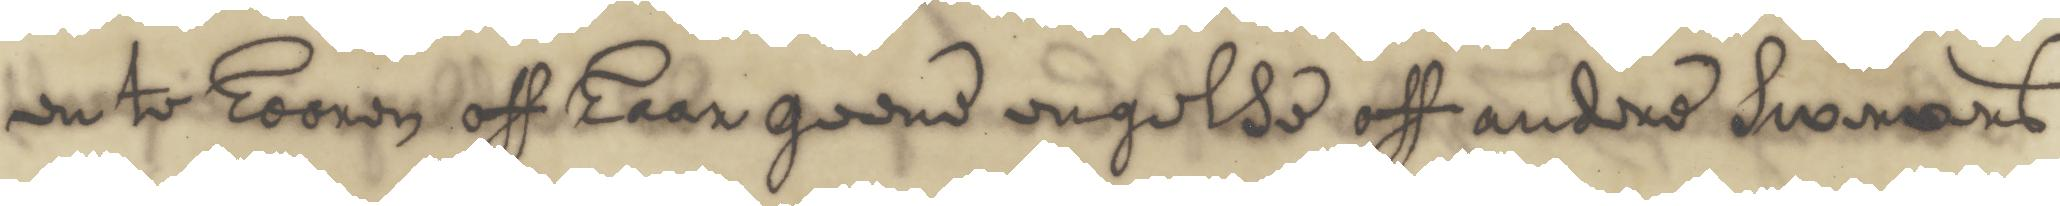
en te hooren off haar geene engelse off andere swervers
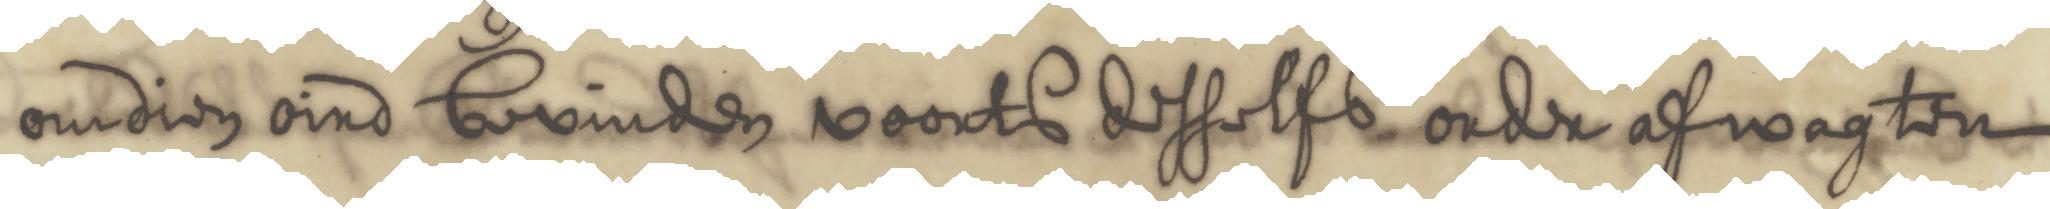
omdien oird bevinden voorts desselfs order afwagten
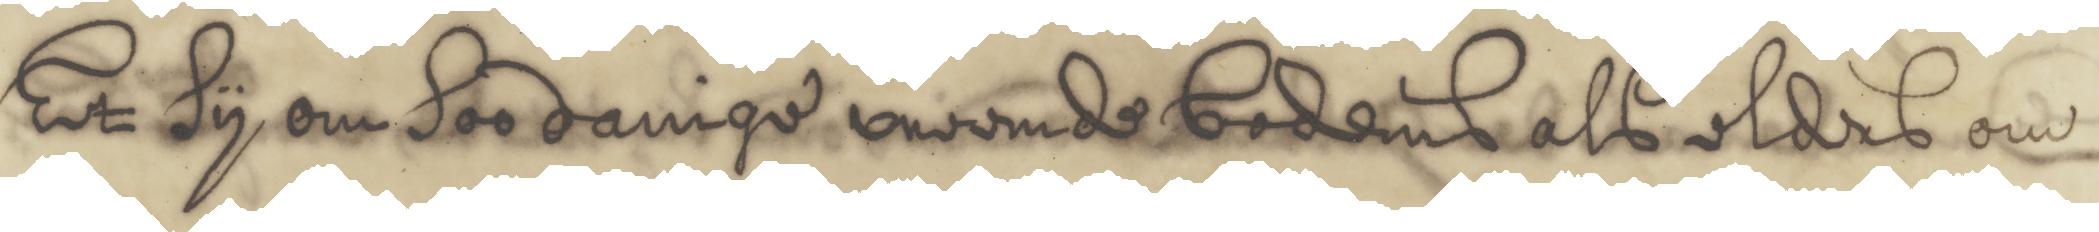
het sij om soodanige vreemde bodems als elders om
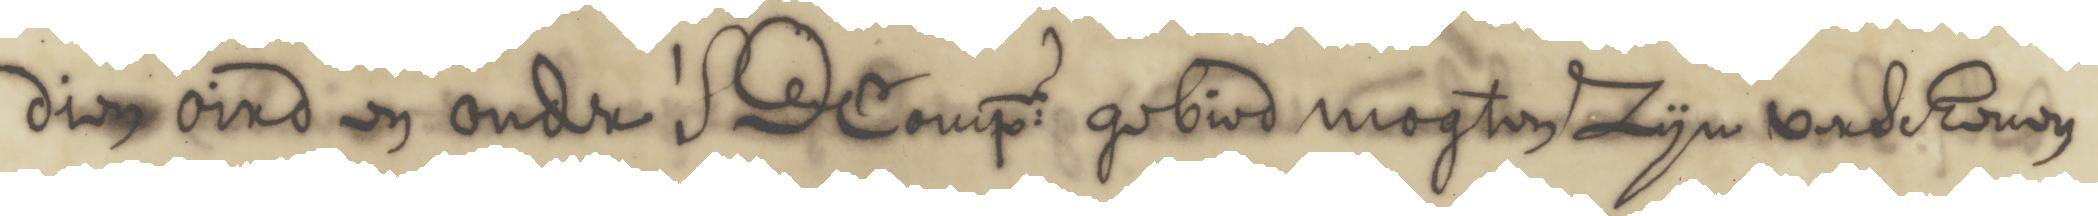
die oirden onder ’sEComp:s gebied mogten zijn verschenen
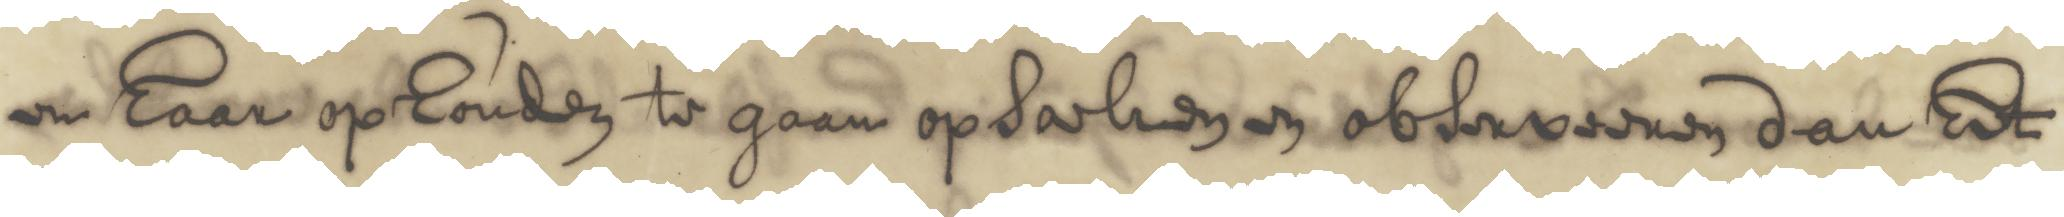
en haar ophouden te gaan opsoeken en observeeren dan het
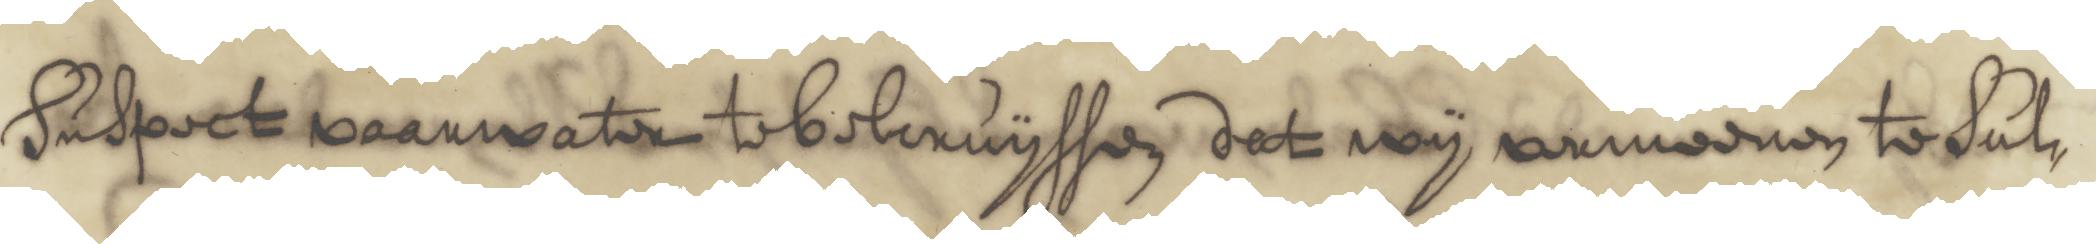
suspect vaarwater te bekruijssen dat wij vermeenen te sul„
